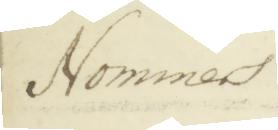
Nommers
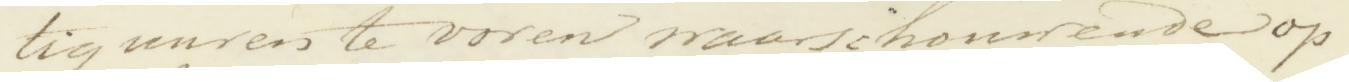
tig uuren te voren waarschouwende op
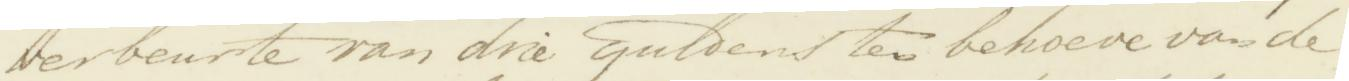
verbeurte van drie guldens ten behoeve van de
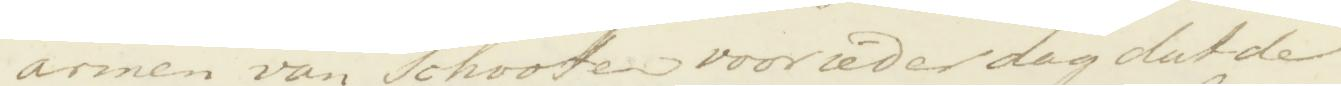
armen van Schooten voor ieder dag dat de
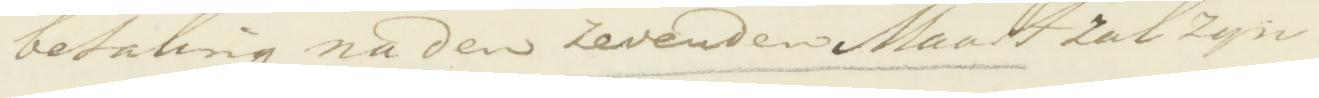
betaling na den zevenden Maart zal zyn
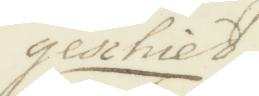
geschied
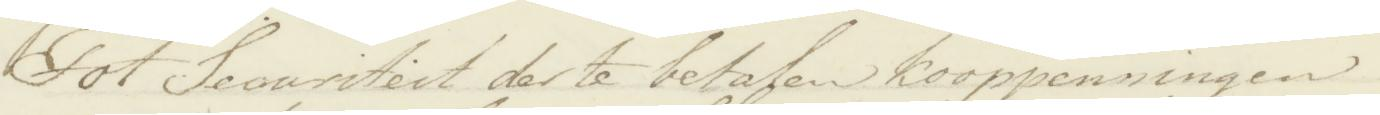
Tot Securiteit der te betalen kooppenningen
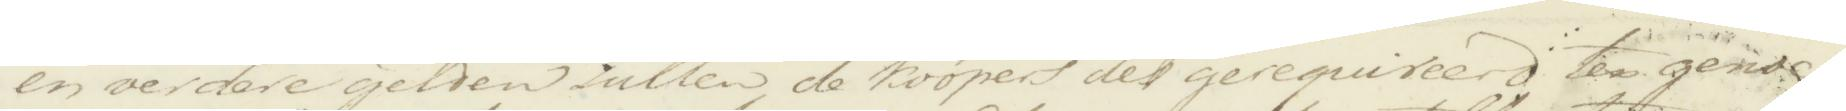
en verdere gelden zullen de koopers des gerequireerd ter genoe
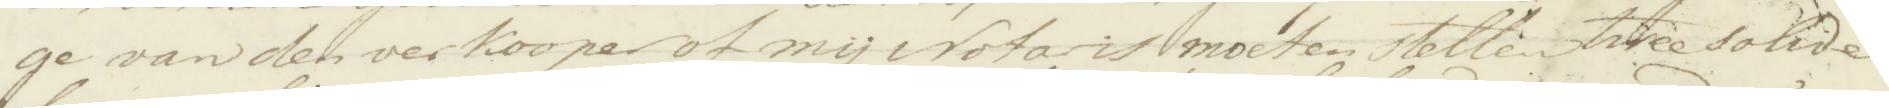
ge van den verkooper of mij Notaris moeten stellen twee solide
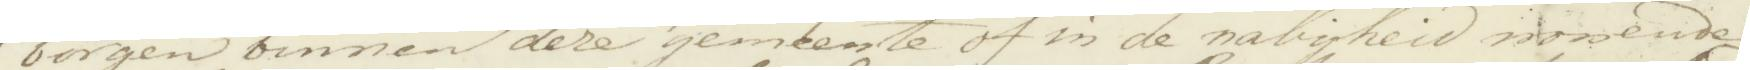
borgen binnen deze gemeente of in de nabijheid wonende
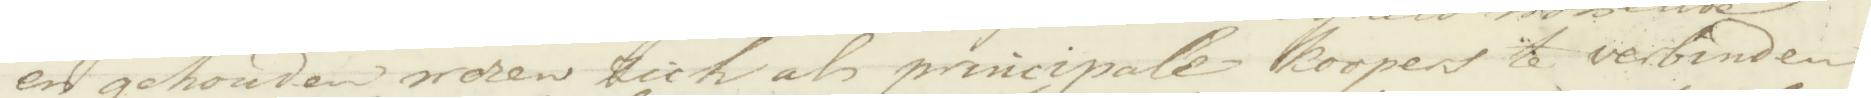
en gehouden waren zich als principale kooper te verbinden
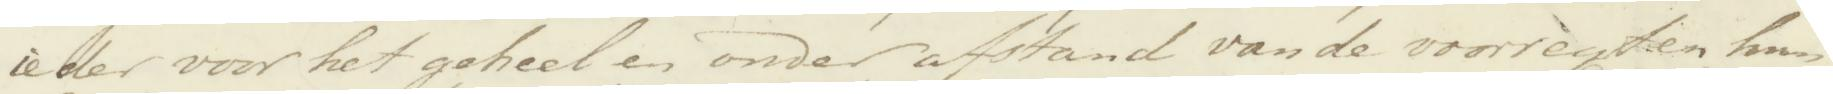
ieder voor het geheel en onder afstand van de voorregten hun
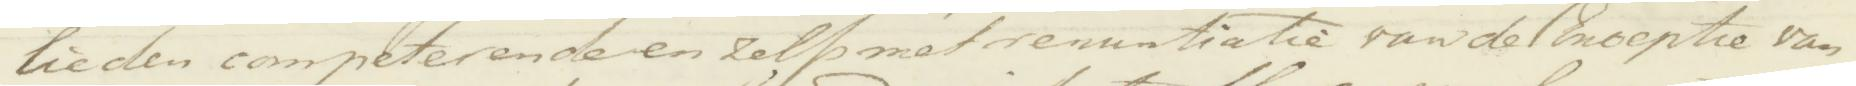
lieden competerende en zelf met renuntiatie van de Inceptie van
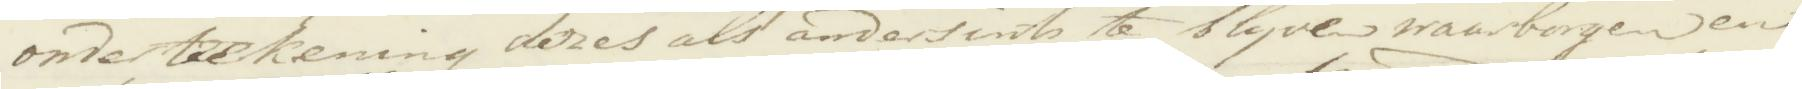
onderteekening dezes als andersints te blyven waarborgen en
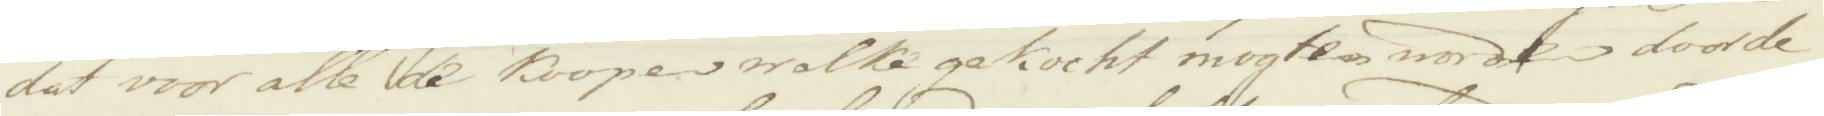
dat voor alle de kooper welke gekocht mogten worden door de
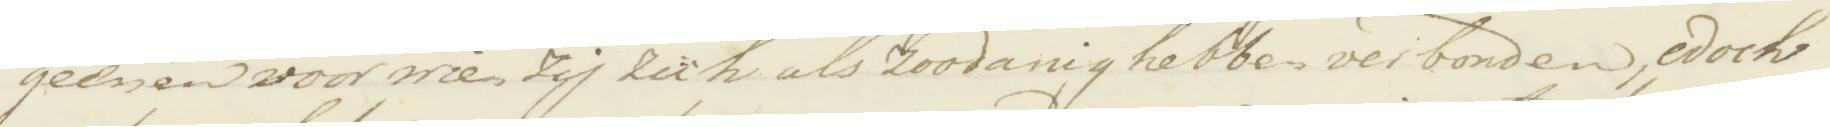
geenen voor wie zij zich als zoodanig hebben verbonden, edoch
